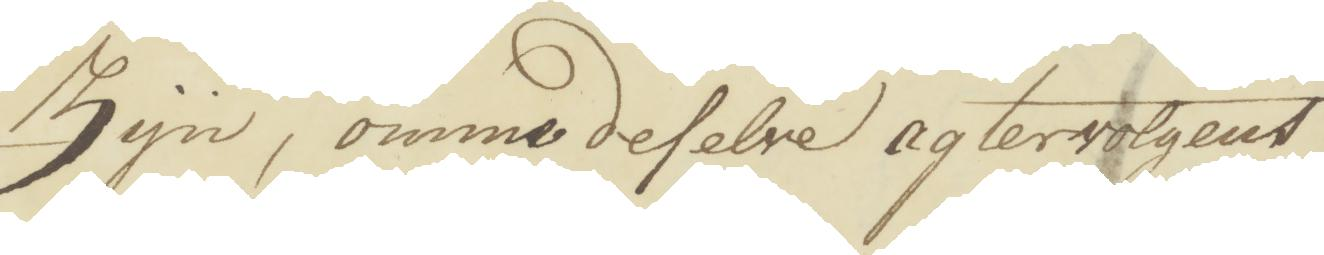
zijn, omme deselve agtervolgens
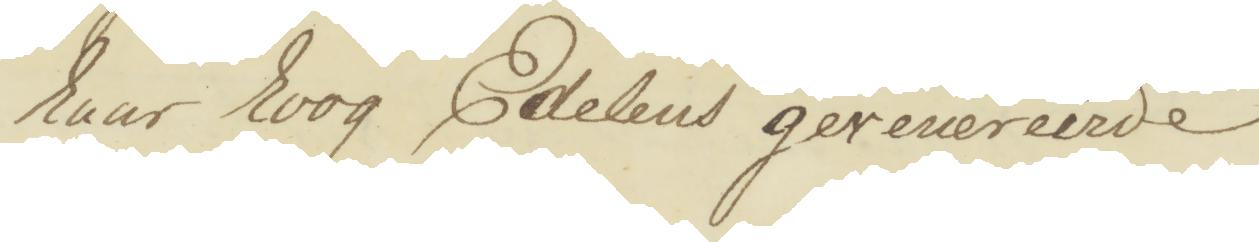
haar hoog Edelens gevenereerde
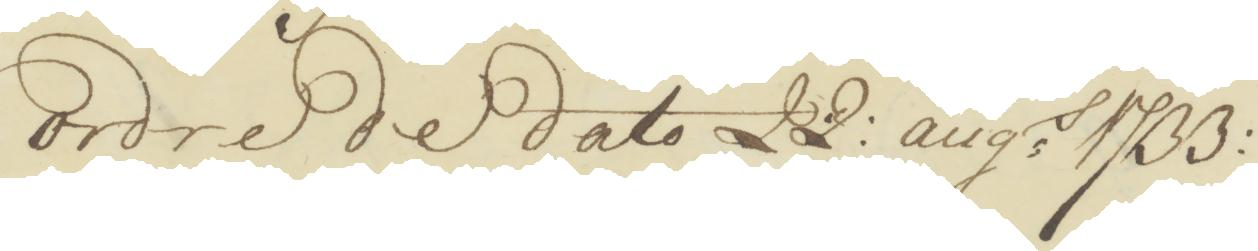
ordre de dato 22: aug:s 1733:
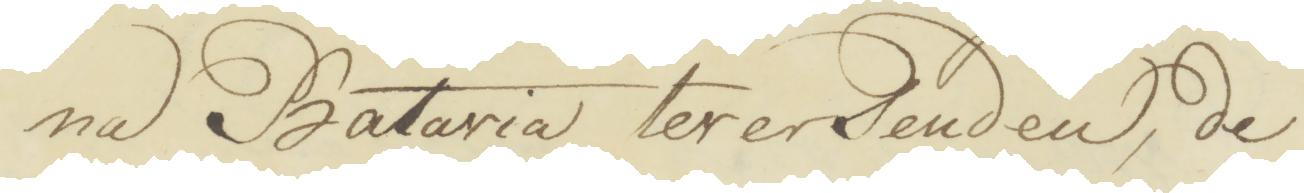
na Batavia teversenden, de
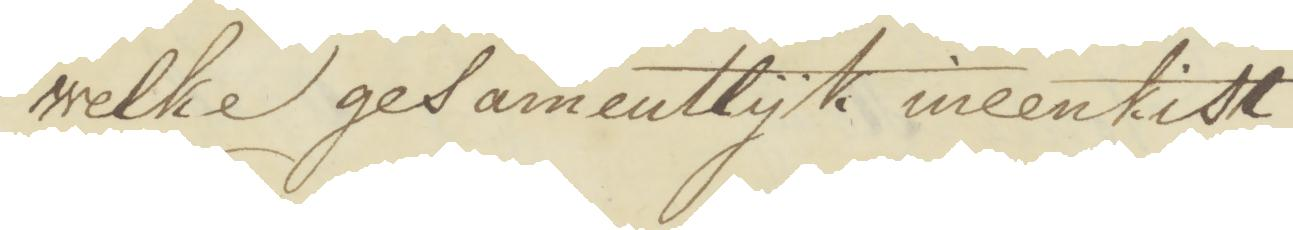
welke gesamentlyk in een kist
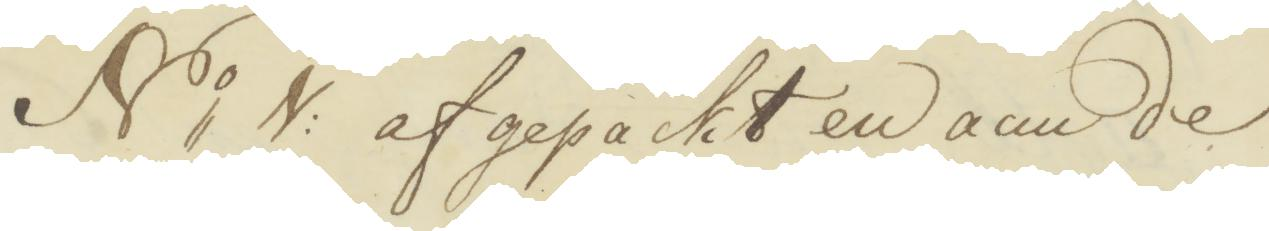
N„o 1: afgepackt en aan de
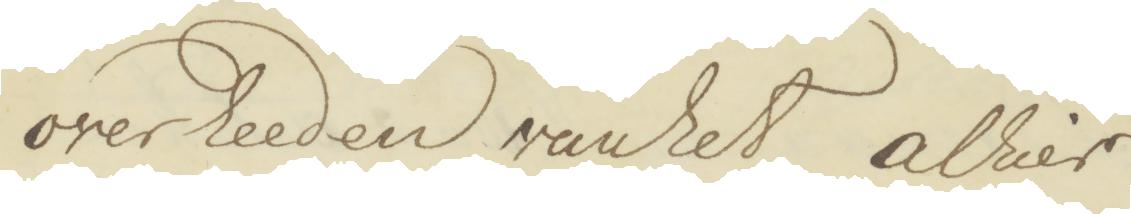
overheeden van het alhier
